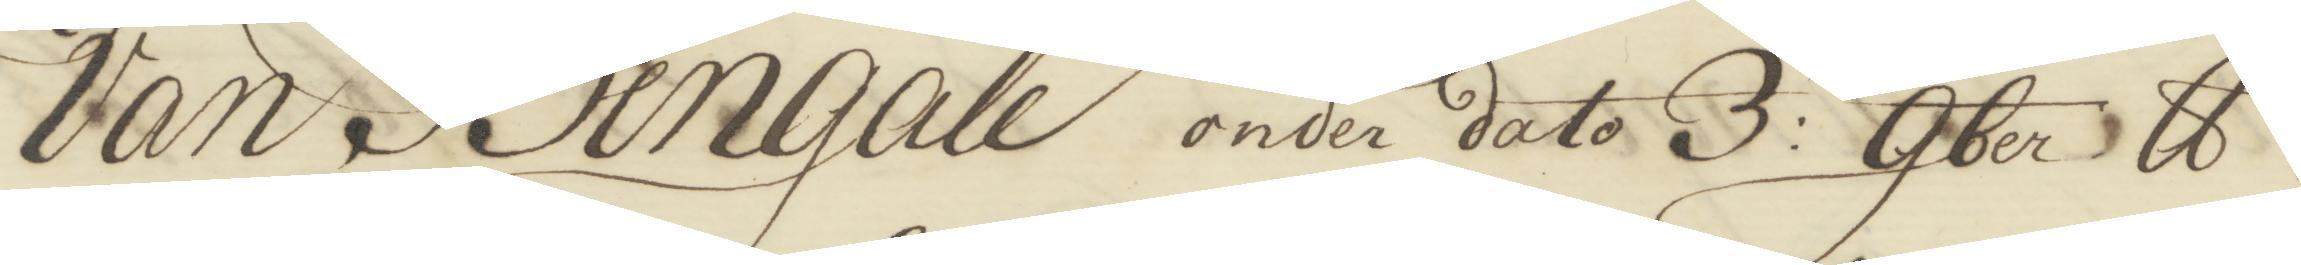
Van Bengale onder dato 3:' gber: A:o 1735
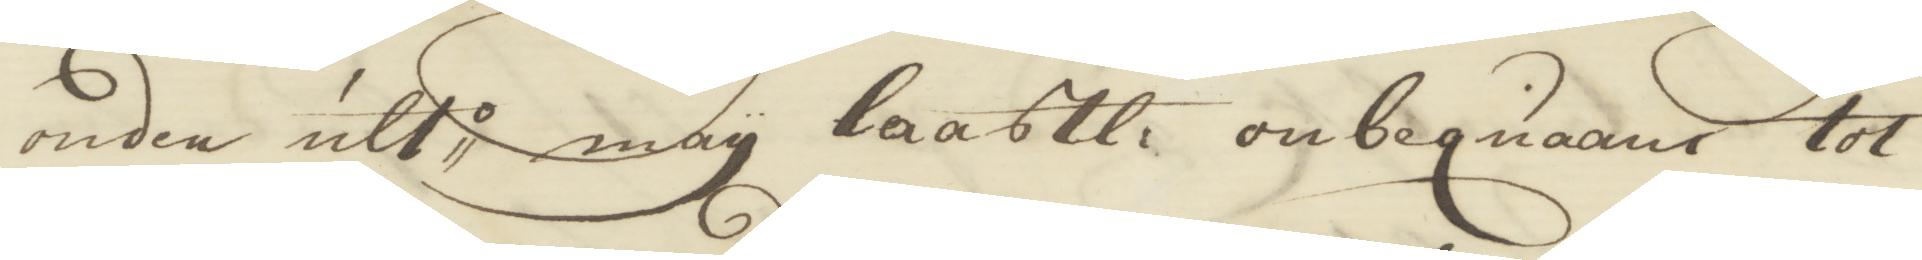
onder ult„o maij laastl: onbequaam tot
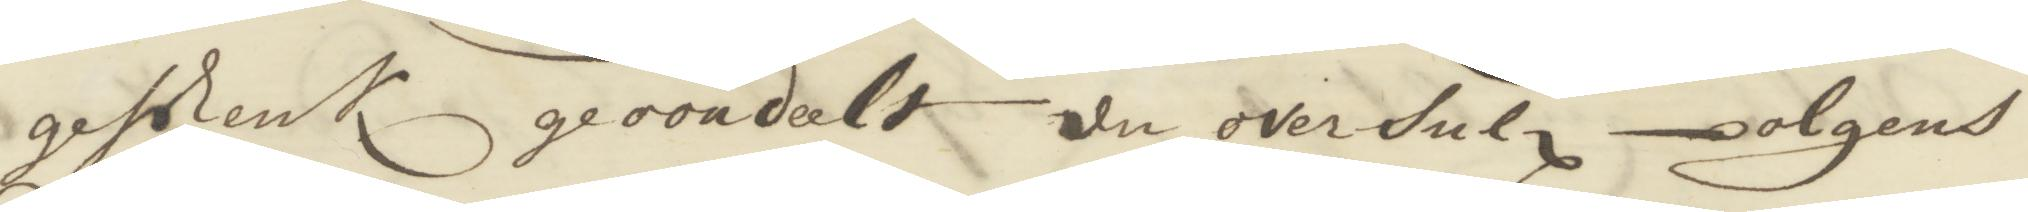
geschenk geoordeelt en over sulx volgens
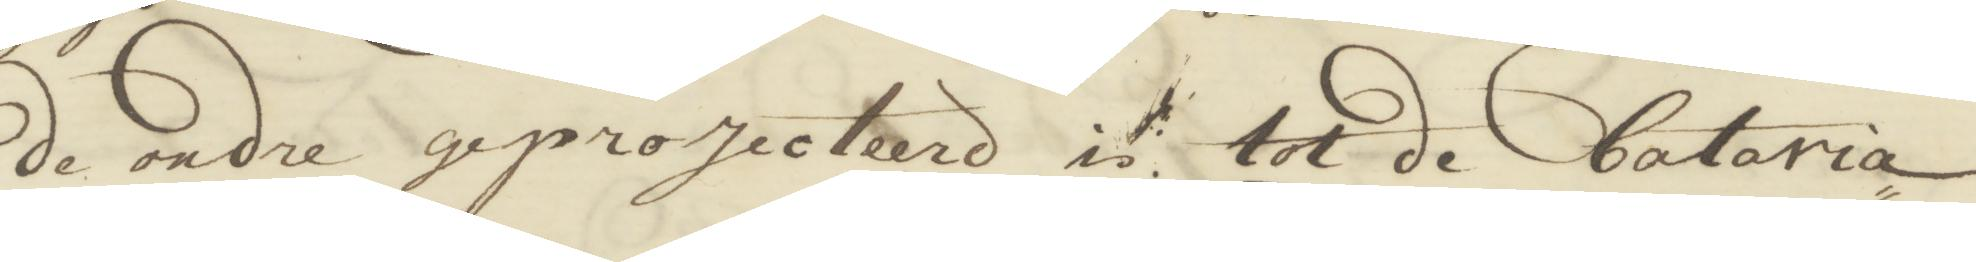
de ordre geprojecteerd is tot de batavia„
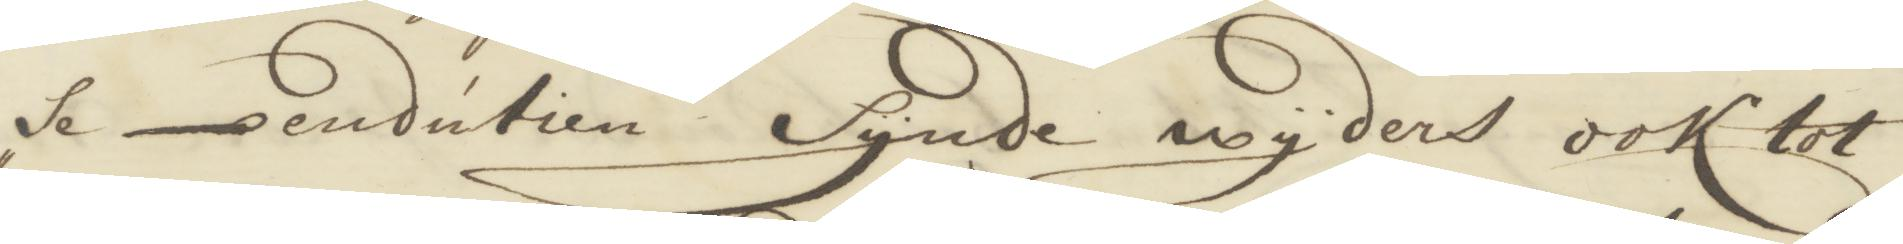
„se vendutien Sijnde wijders ook tot
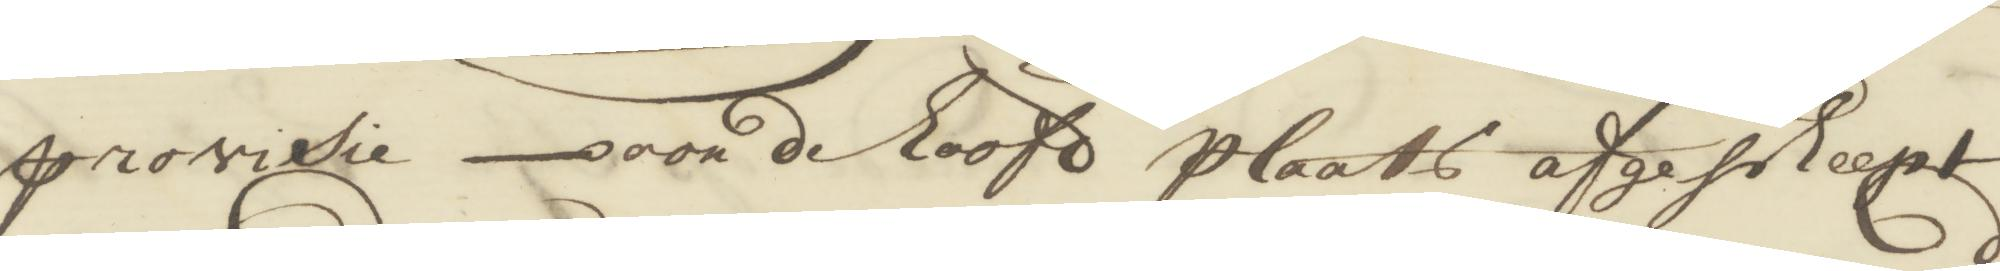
provisie voor de hoofd plaats afgescheept
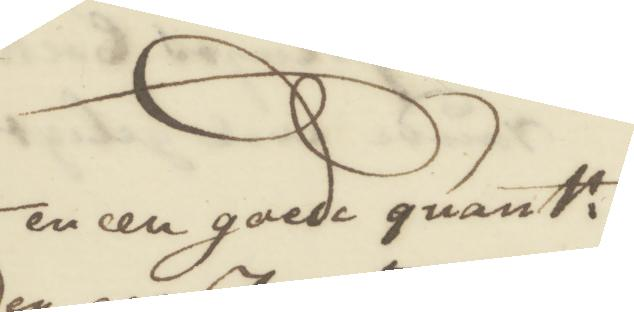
en een goede guant:
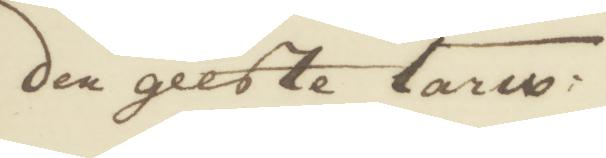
der geeste tarw:
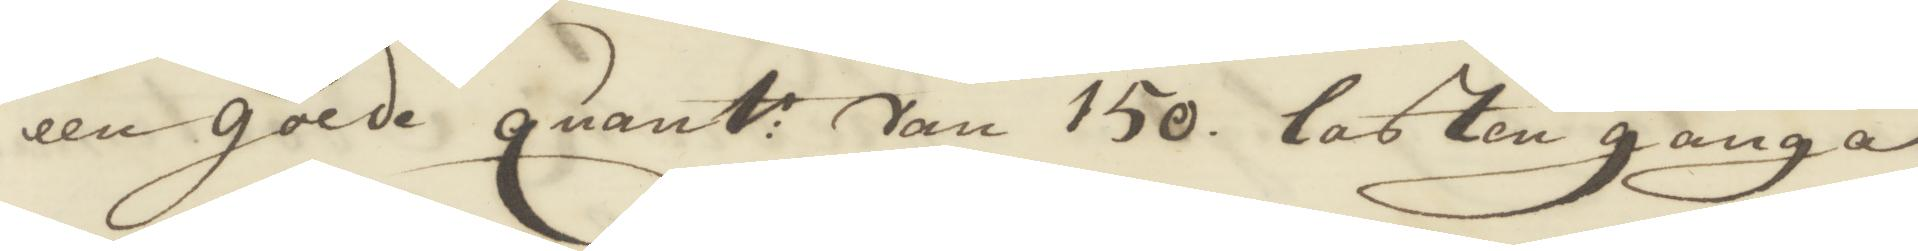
een goede quant: van 150. lasten ganga
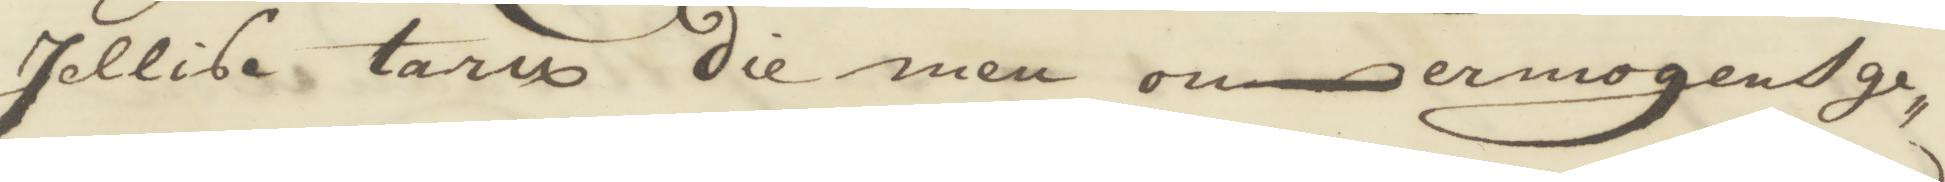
Jellise tarw die men onvermogens ge„
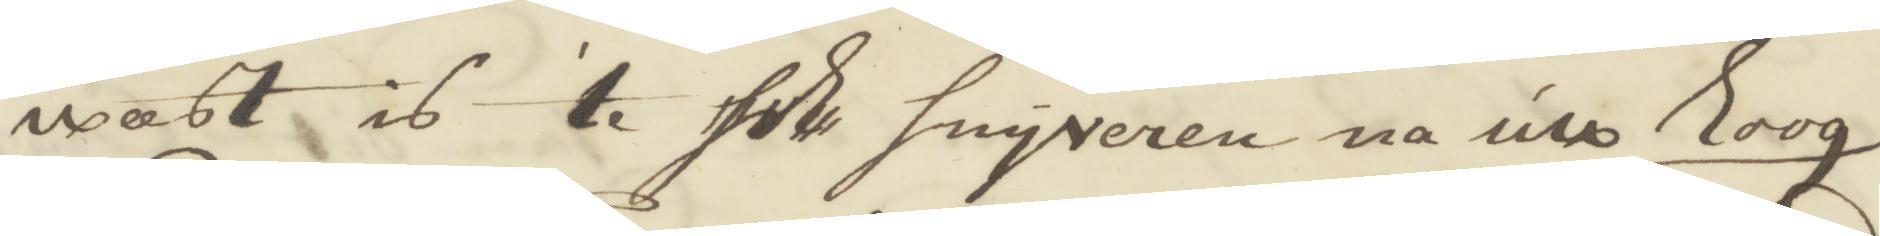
west is te sch suijveren na uw hoog
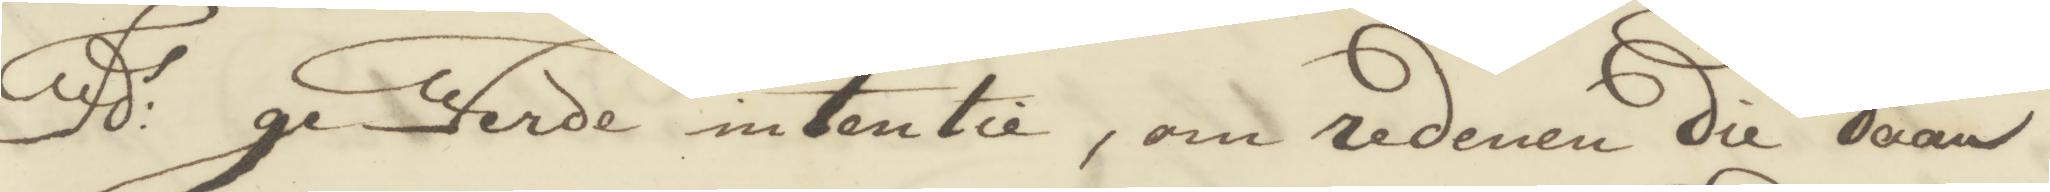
Ed:s ge Eerde intentie, om redenen die daar
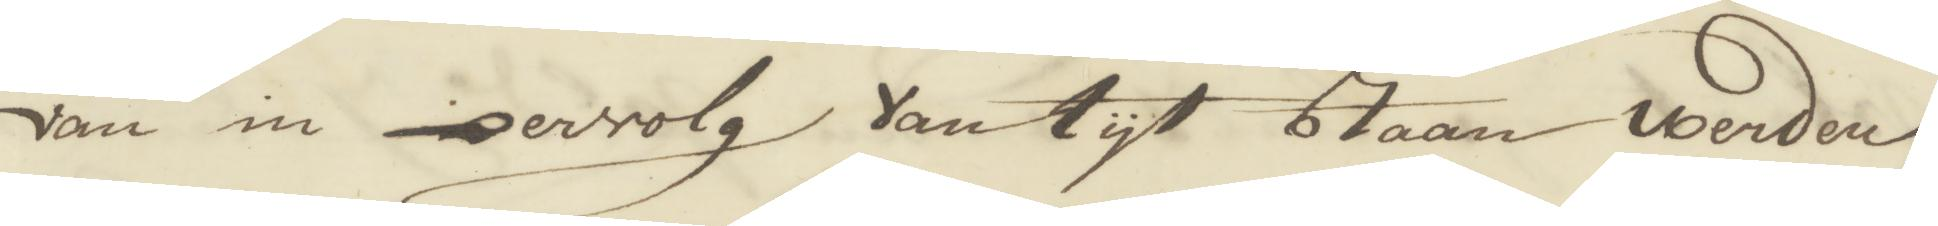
van in vervolg van tijt staan werden
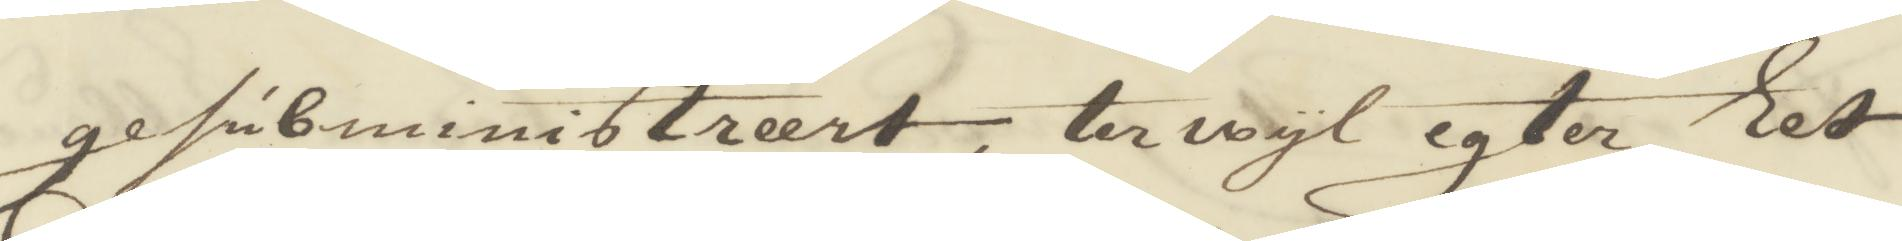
gesubministreert, terwijl egter het
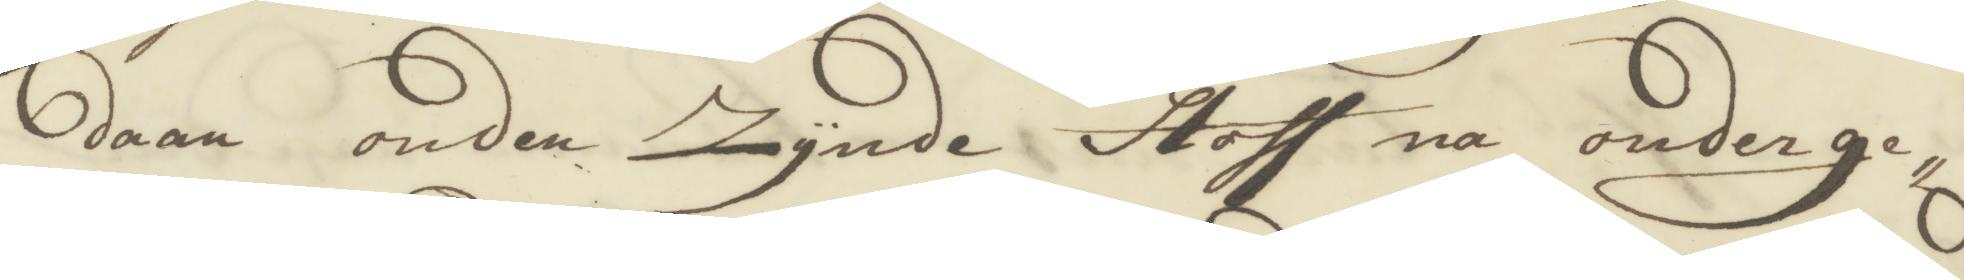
daar onder Zijnde stoff na ouderge„
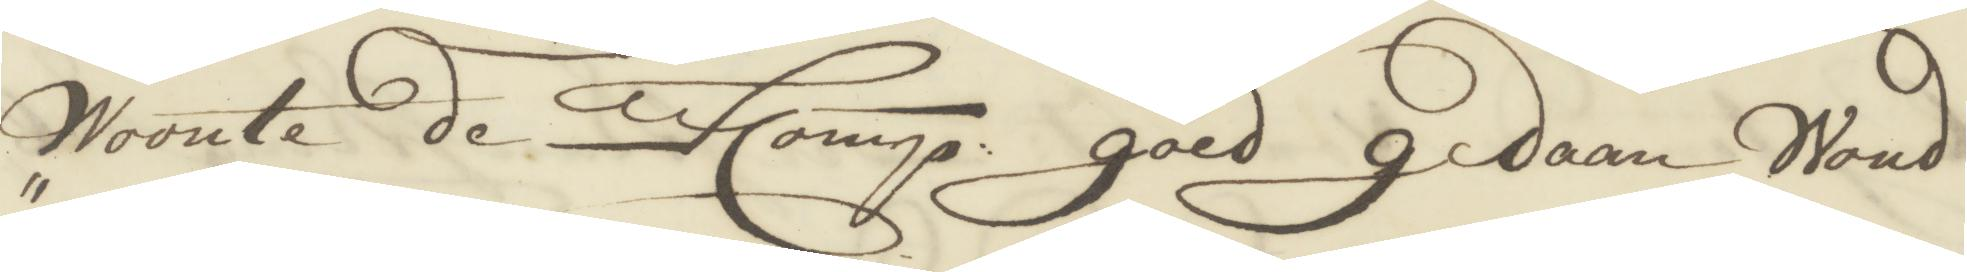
woonte de EComp: goed gedaan word
